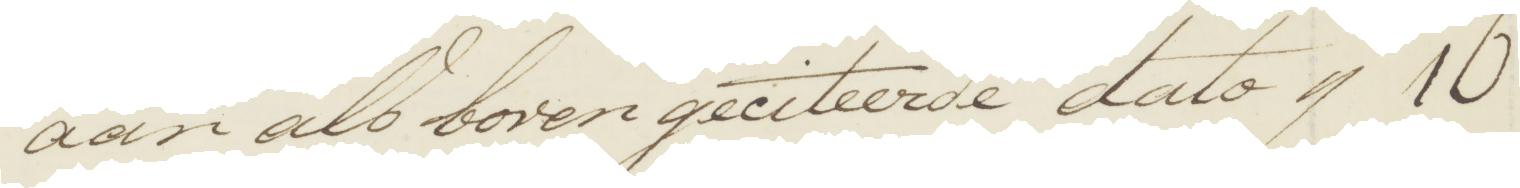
aan als boven geciteerde dato „ 16
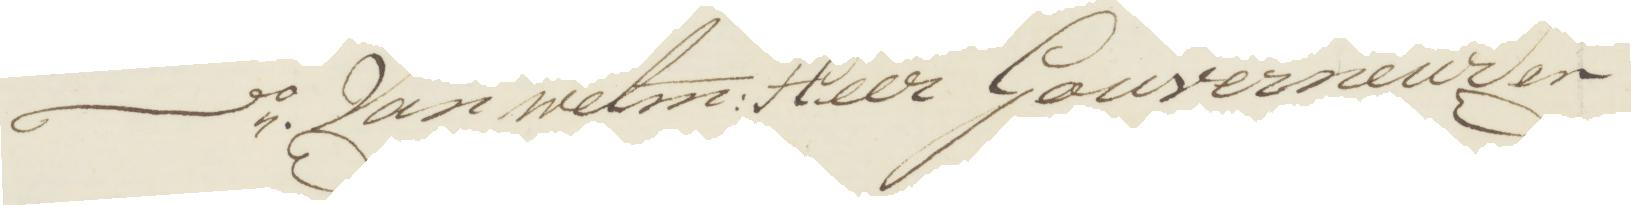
_„o. Van welm: Heer Gouverneur en
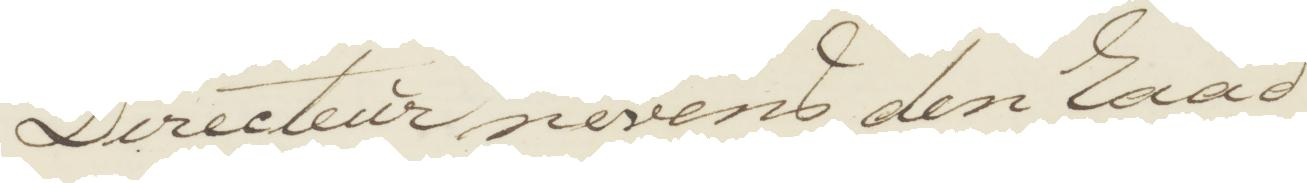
Directeur nevens den raad
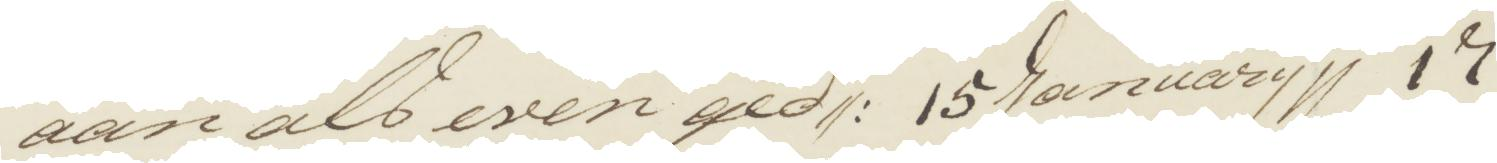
aan als even ged„t: 15 Januarij „ 17
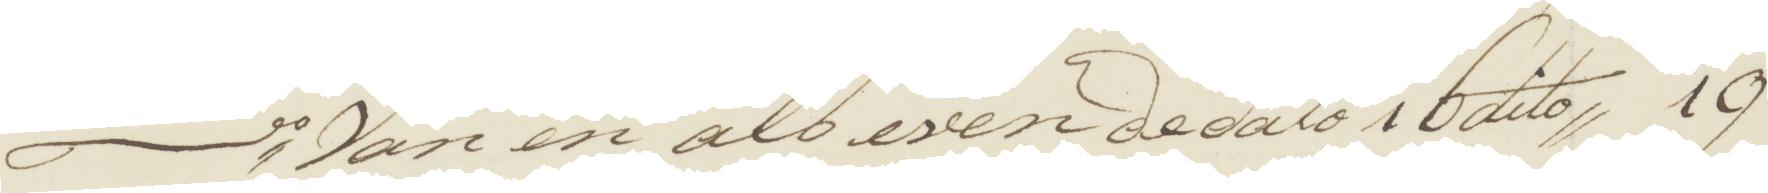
_„o van en als even de dato 16 dito „ 19
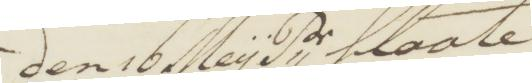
den 16 Meij P„r sloote
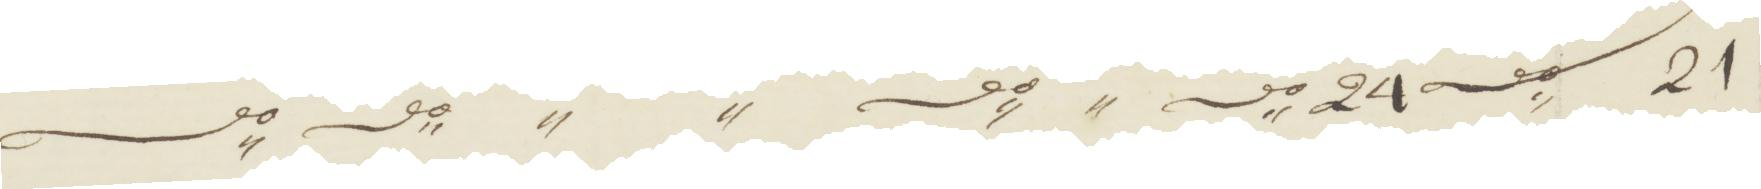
_„o _„o „ „ _„o „ _„o 24 _„o 21
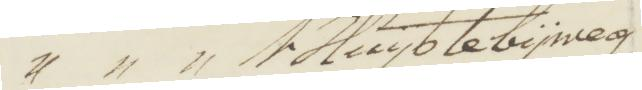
„ „ „ t Huijs te bijweg
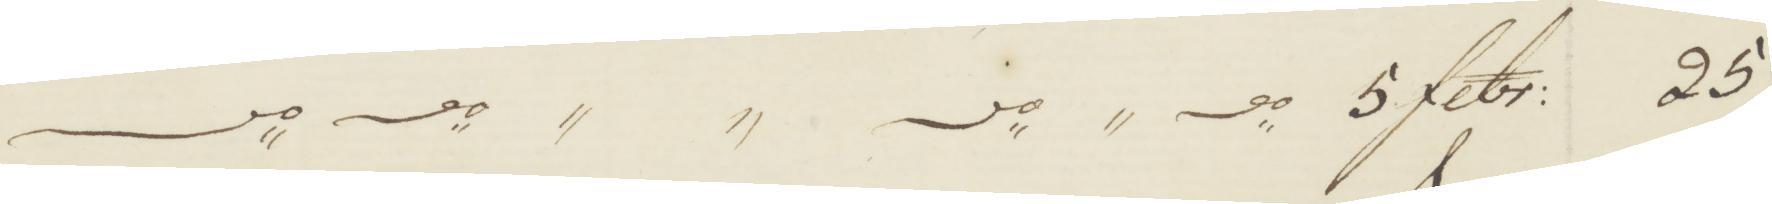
_„o _„o „ „ _„o „ _„o 5 febr: 25
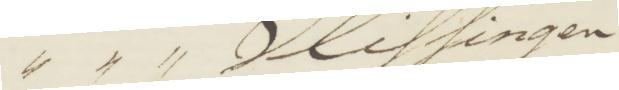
„ „ „ Vlissingen
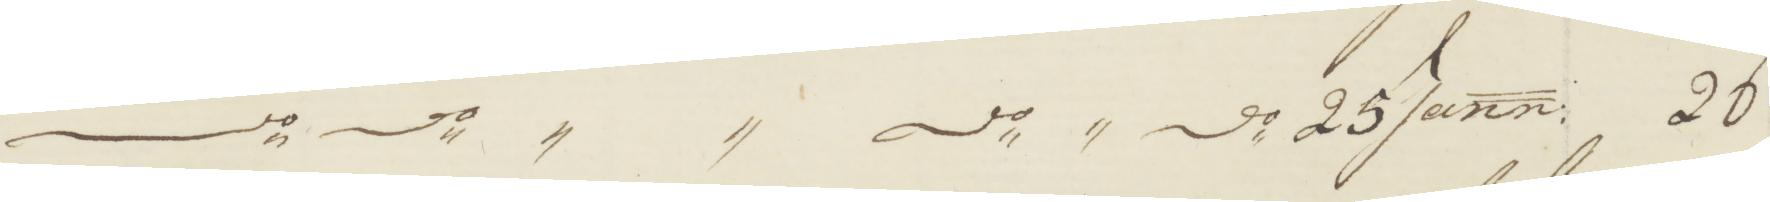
_„o _„o „ „ _„o „ _„o 25 Jann: 26
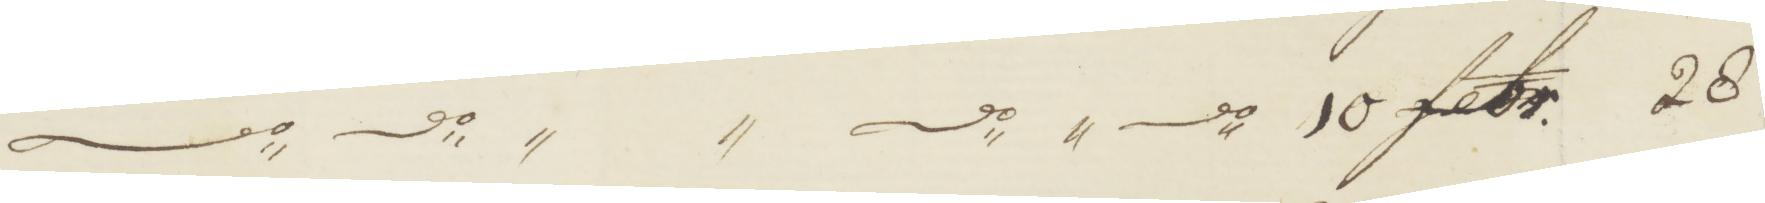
_„o _„o „ „ _„o „ _„o 16 febr. 28
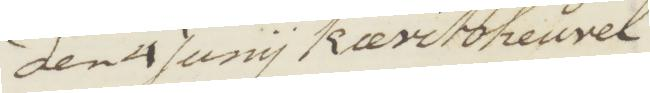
den 4 Junij Kievitsheuvel
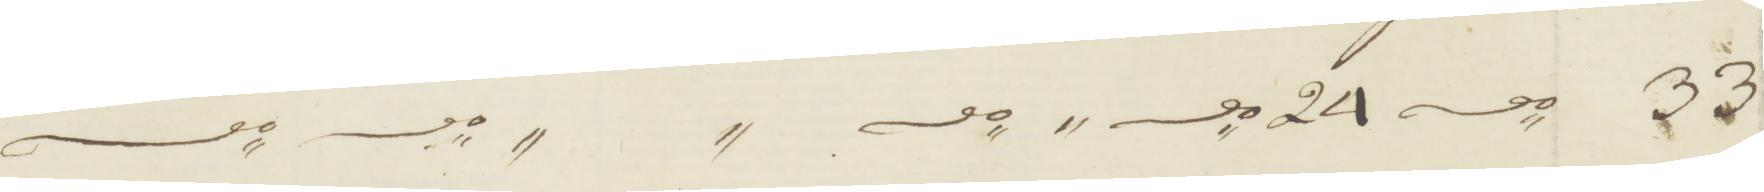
_„o _„o „ „ _„o „ _„o 24 _„o 33
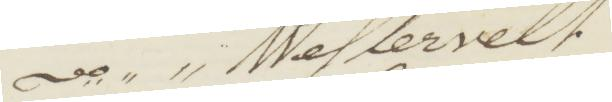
_„o „ „ Westervelt
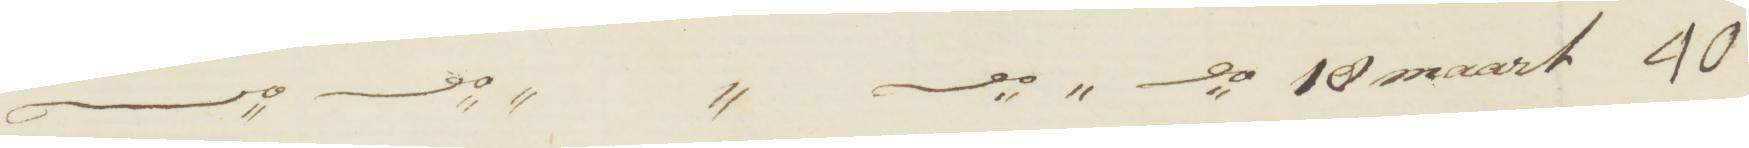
_„o _„o „ „ _„o „ _„o 18 maart 40
